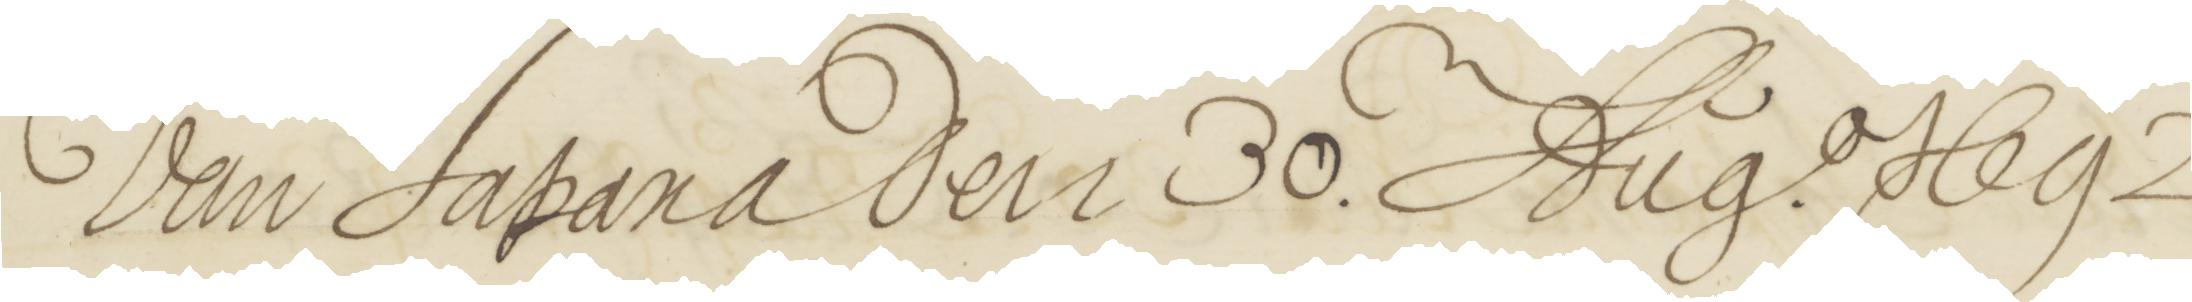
Van Iapara den 30. Aug.o 1692
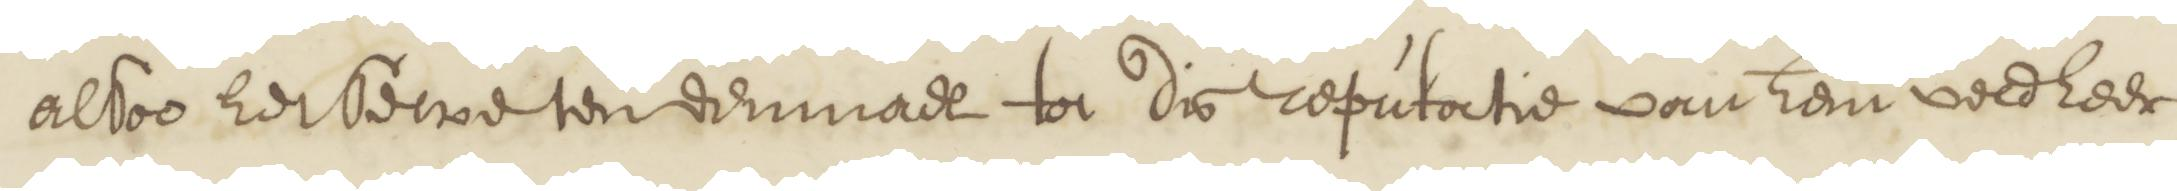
alsoo het selve ten eenmael tot disreputatie van hem veldheer
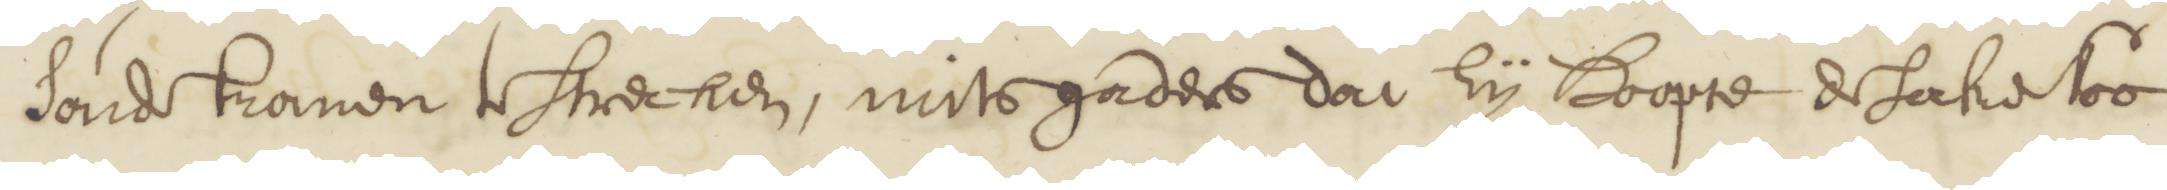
soude komen testrecken, mitsgaders dat hij Hoopte desake soo
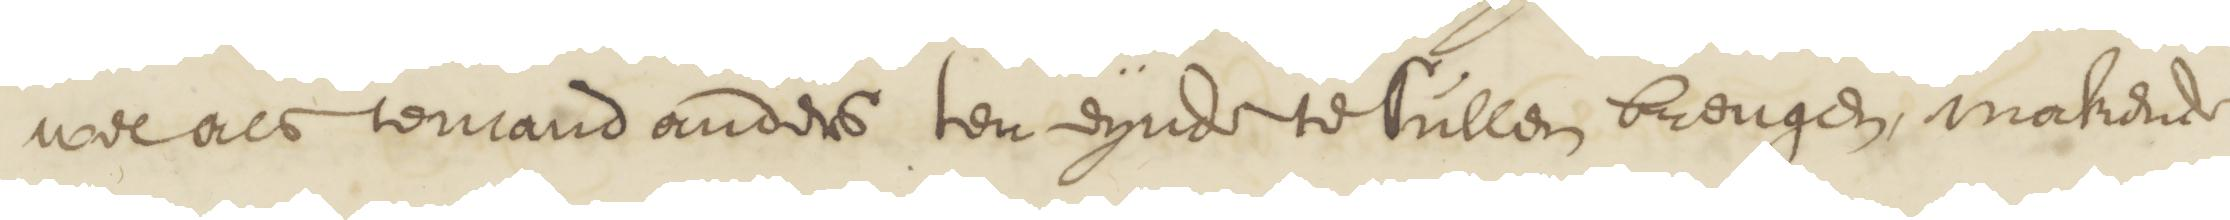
wel als iemand anders ten eijnde te sullen brengen, makende
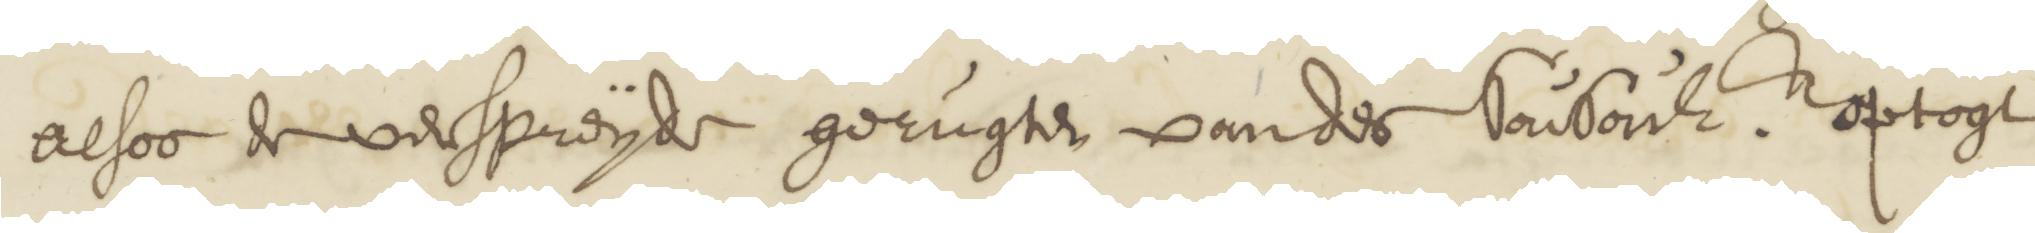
alsoo de verspreijde gerugten vandes sousouh. optogt
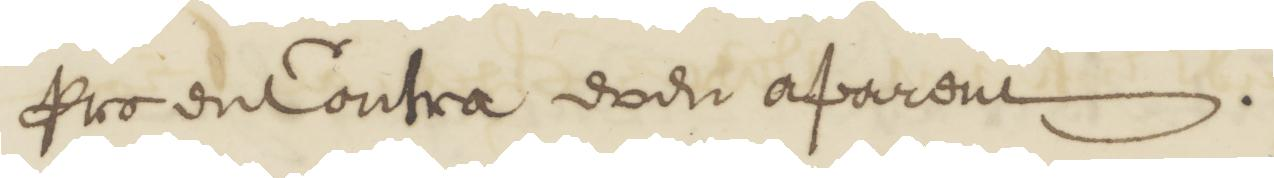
pro en Contra even aparent.
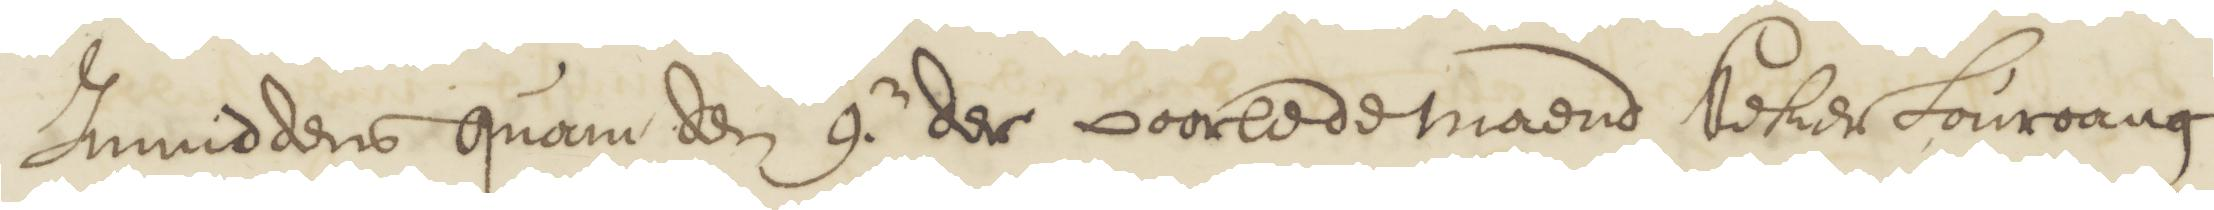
Inmiddens quam den 9.en der voorledet maend seker souroang
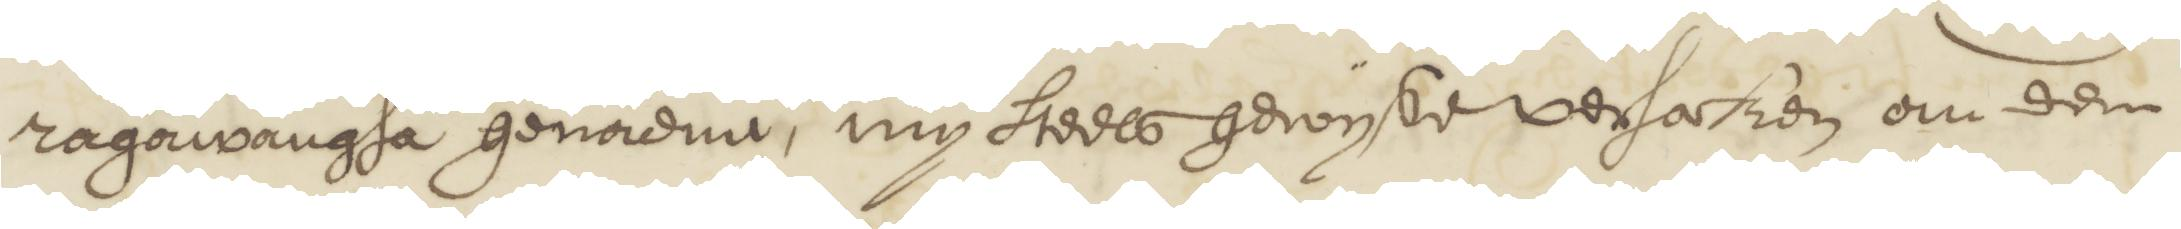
ragawangsa genaemt, mij steels gewijse versoeken om een
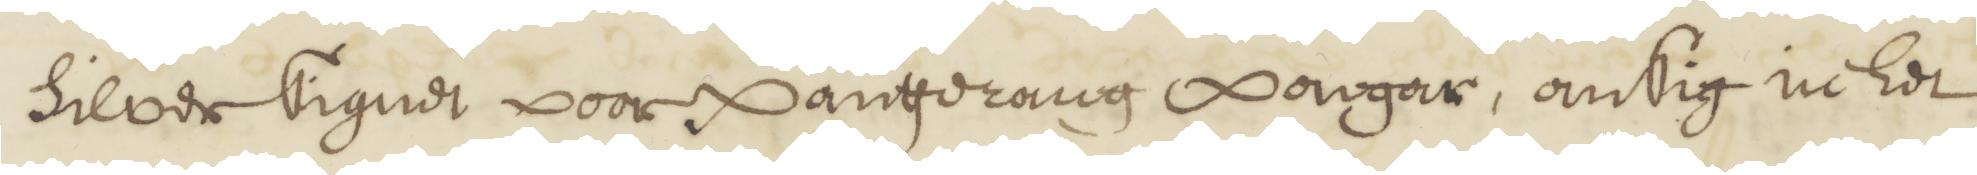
silver signet voor pantgerang pongar, omsig in het
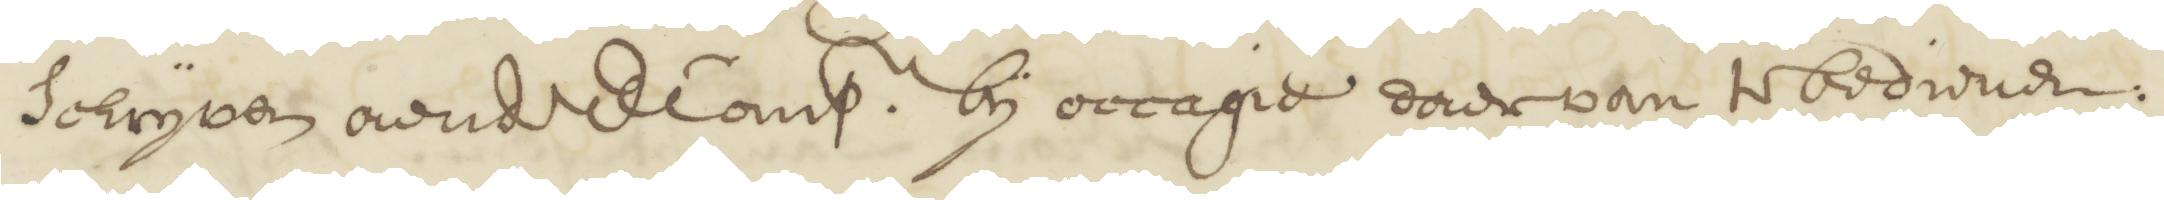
schrijven aende EComp. bij occagie daer van te bedienen:
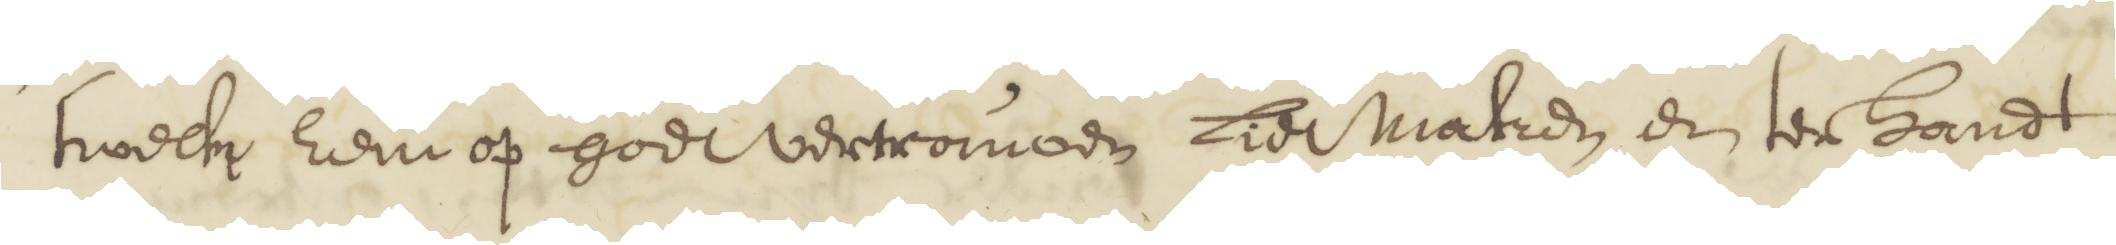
'twelk hem op goet vertrouwen liet maken en ter handt
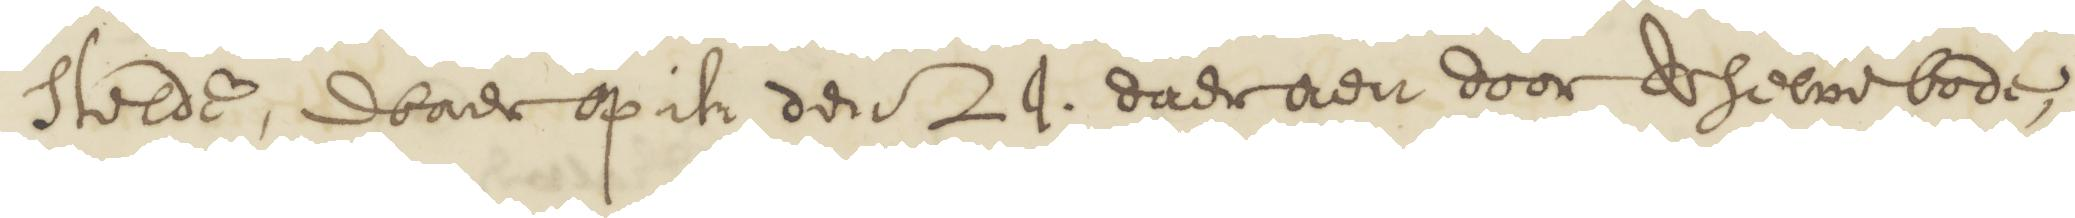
stelde, waer op ik den 24. daer aen door deselve bode,
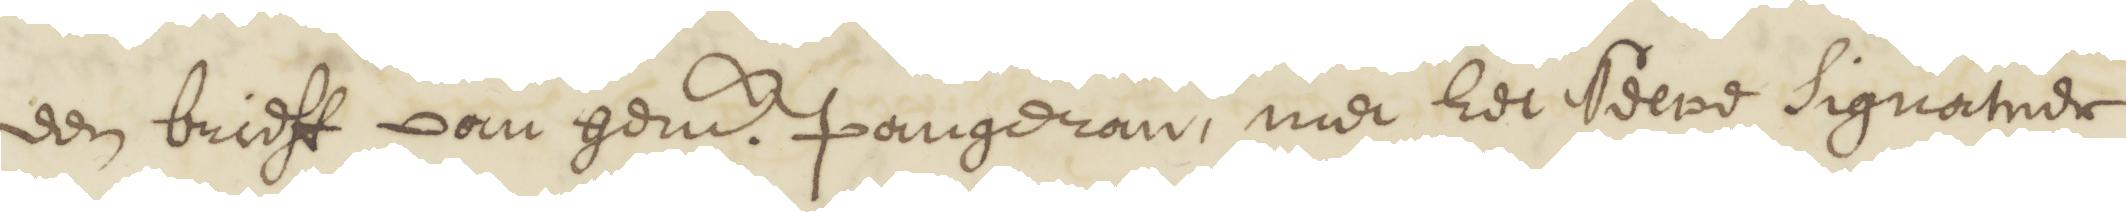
een brieff van gem: pangeran, met het selve signatuer
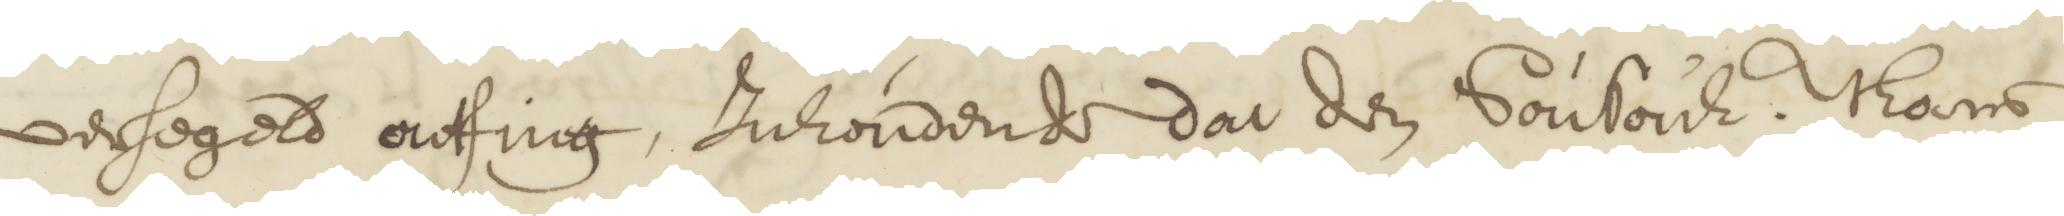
versegeld ontfing, Inhoudende dat den sousouh. thans
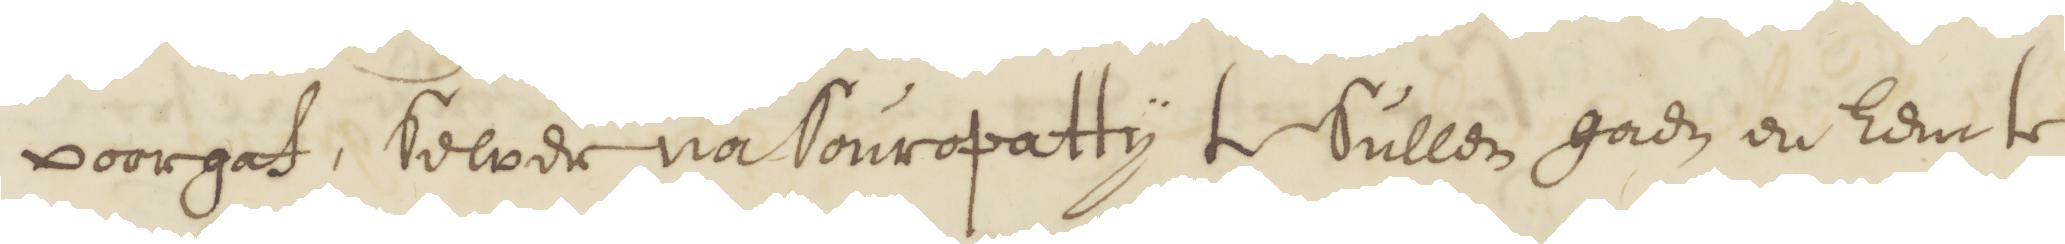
voorgaf, selver na souropattij te sullen gaen en hem te
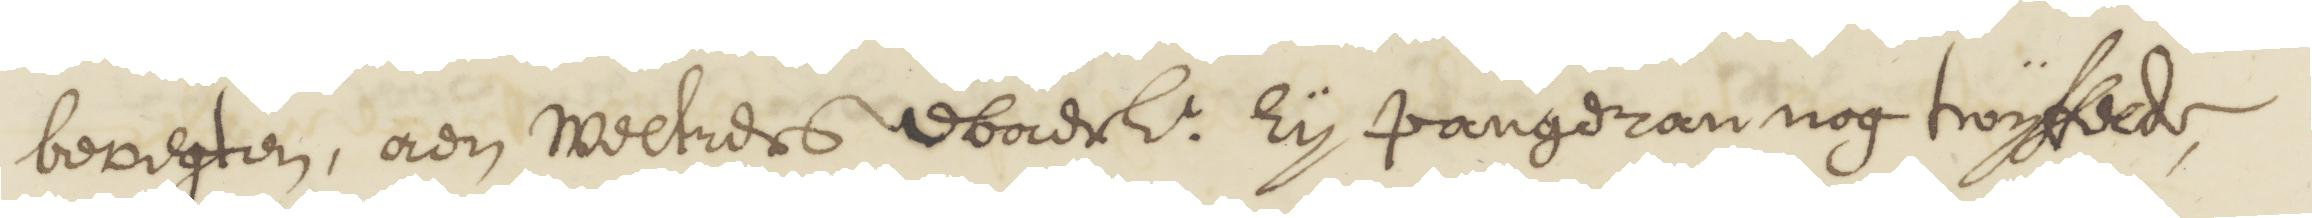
bevegten, aen welkers waerh.t hij pangeran nog twijffelde,
